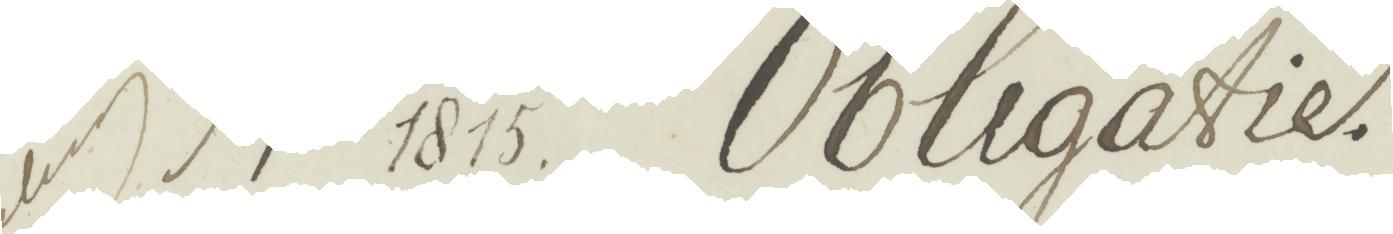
N 1815. Obligatie.
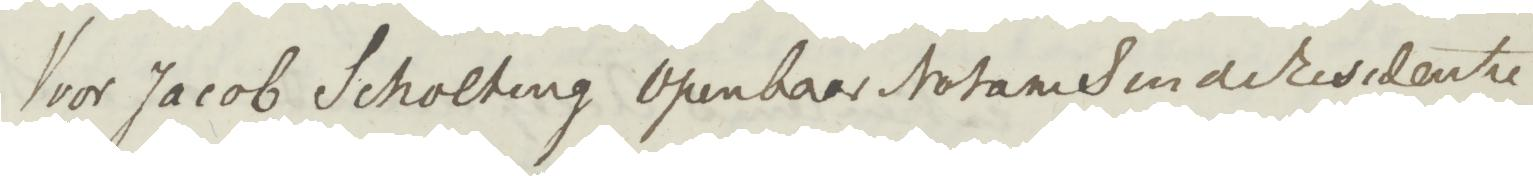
Voor Jacob Scholting openbaar Notaris in de residentie
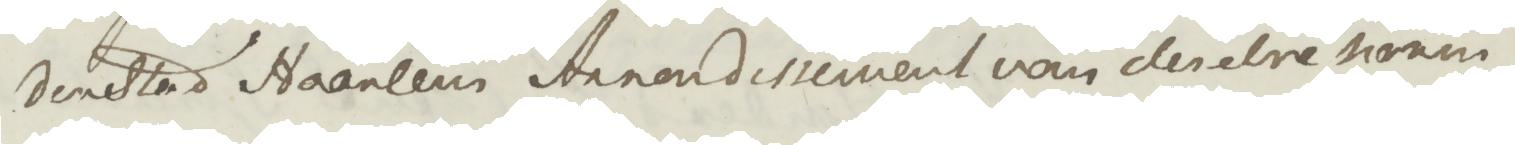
der stad Haarlem Arrondissement van dezelve naam
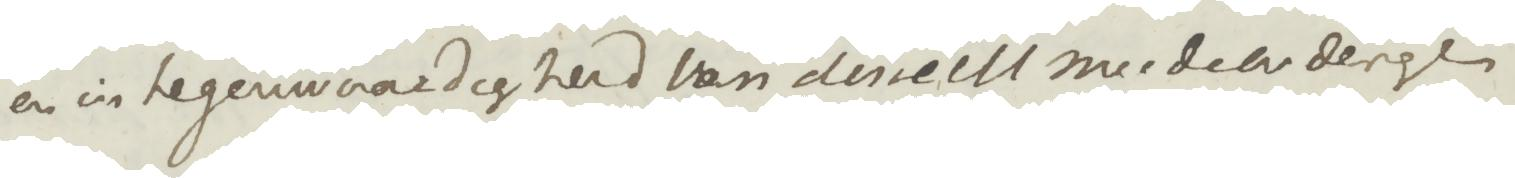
en in tegenwoordigheid van dewelk meeden onderge
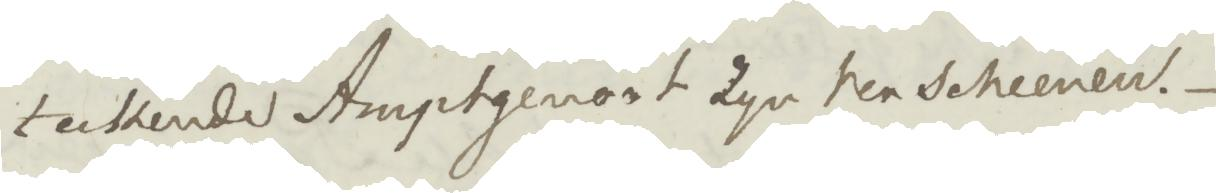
teekende Amptgenoot zyn verscheenen.—
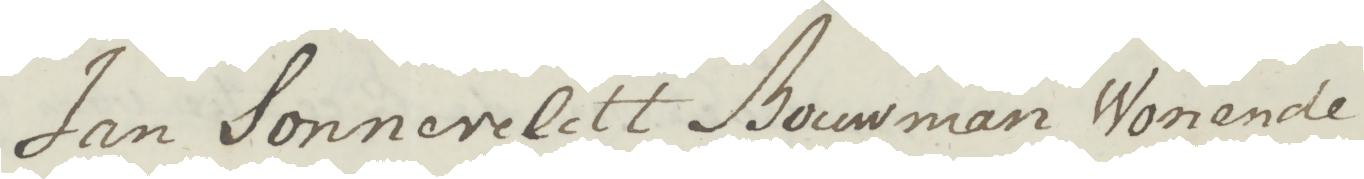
Jan Sonneveldt Bouwman Wonende
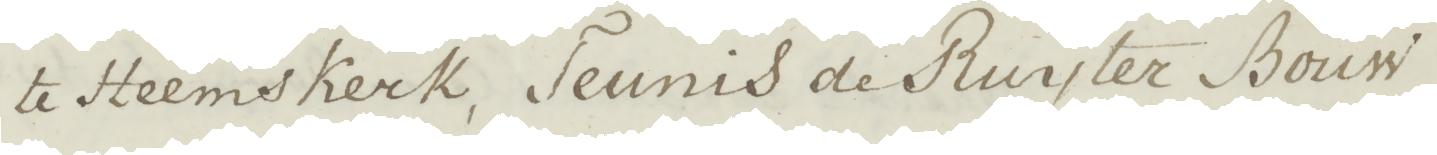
te Heemskerk, Teunis de Ruyter Bouw
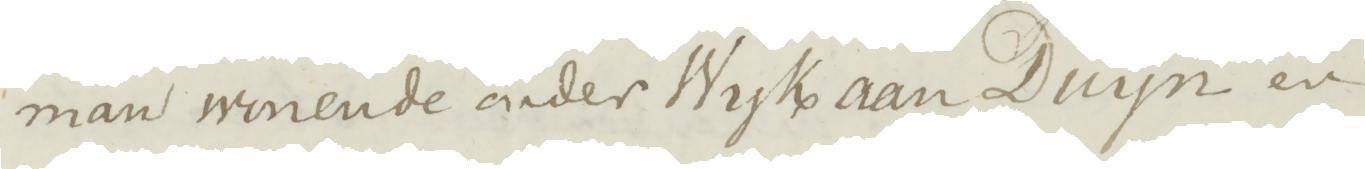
man wonende onder Wyk aan Duijn en
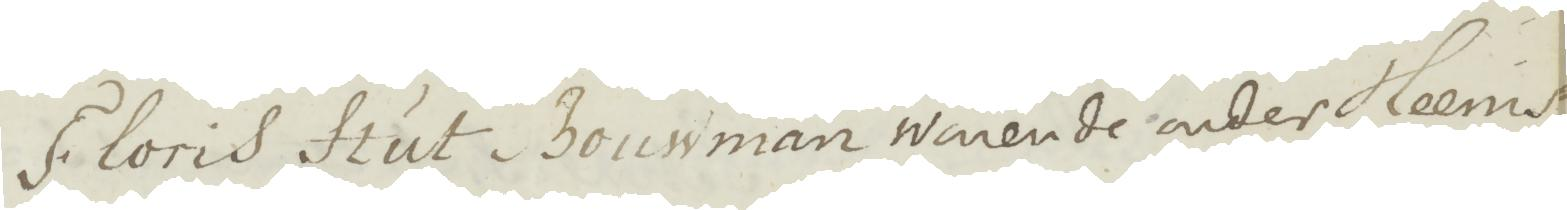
Floris Stut Bouwman wonende onder Heems
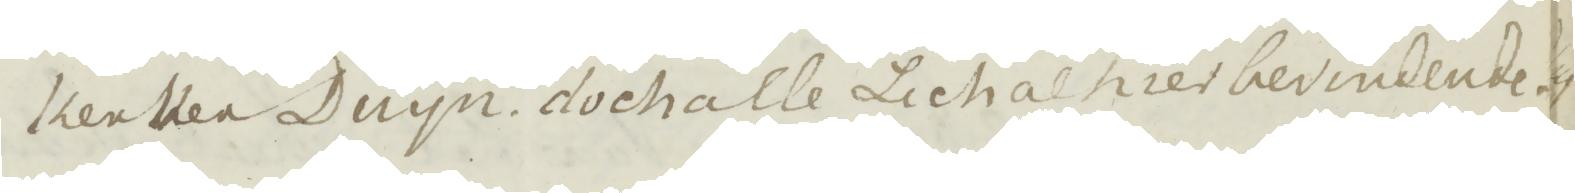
kerken Duijn. doch alle zich al hier bevindende.
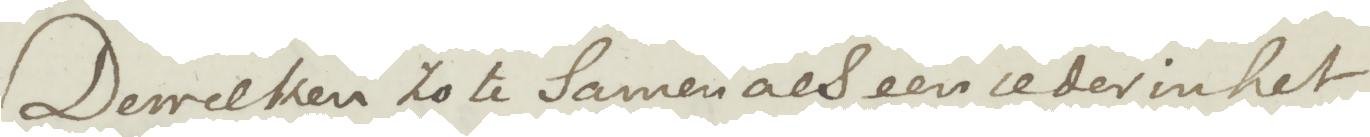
Dewelken zo te samen als een ieder in het
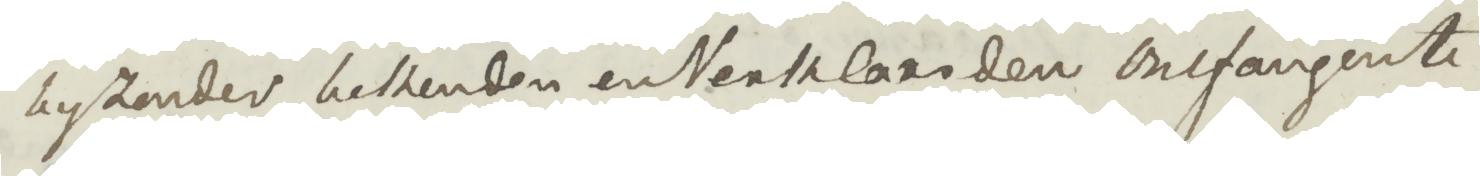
byzonder bekenden en Verklaarden ontfangen te
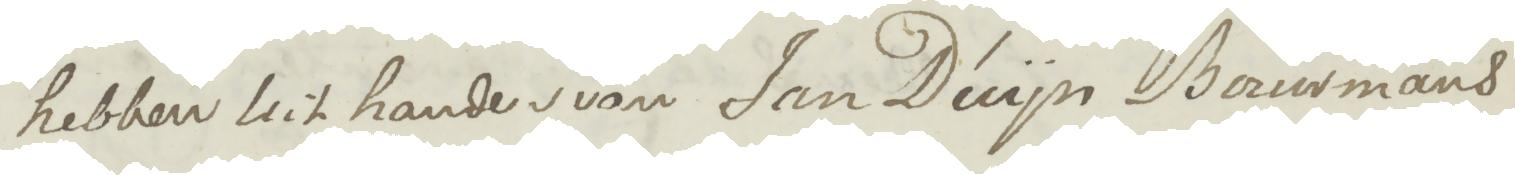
hebben uit handes van Jan Duijn Bouwmans
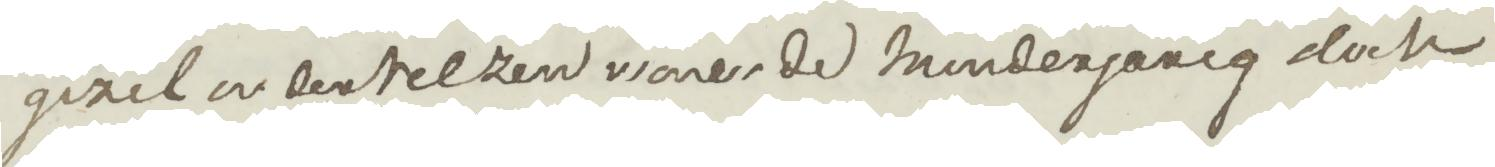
gezel in den Velzen wonende Minderjarig doch
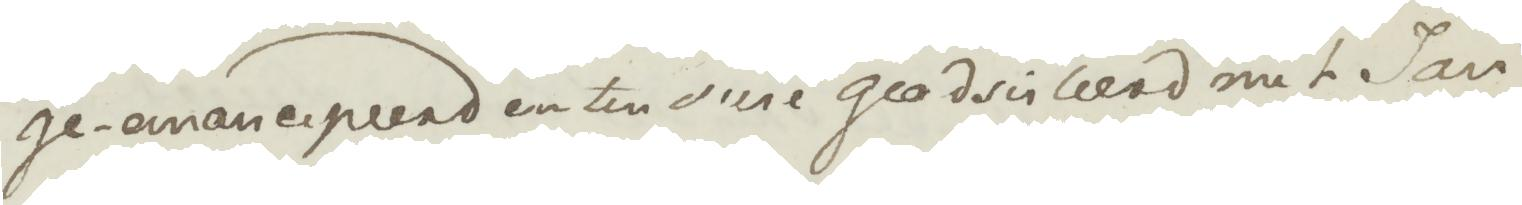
ge-emancipeerd en ten deese geadsisteerd met Jan
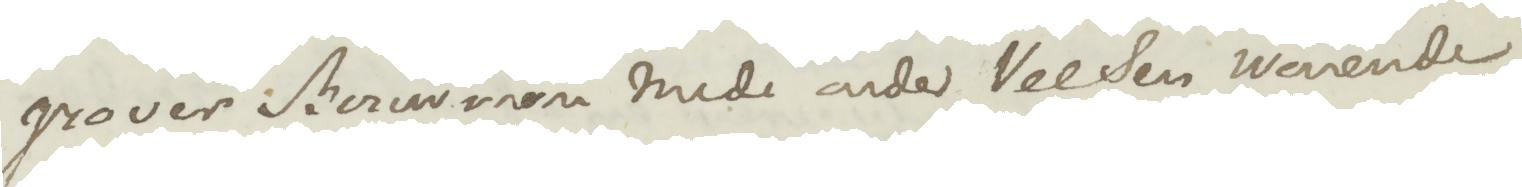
grover Bouwman mede onde Velsen wonende
